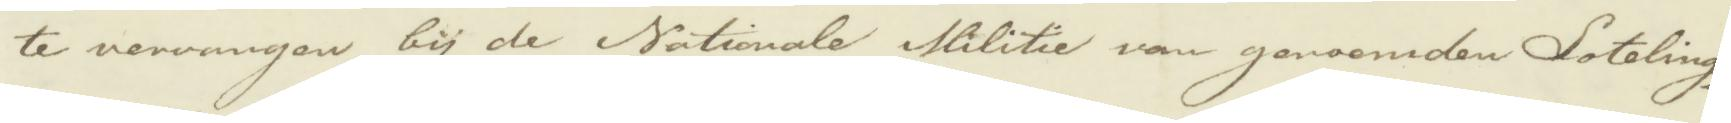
te vervangen bij de Nationale Militie van genoemden Loteling,
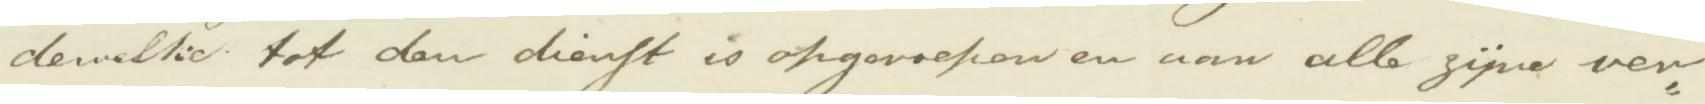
dewelke tot den dienst is opgeroepen en aan alle zijne ver„
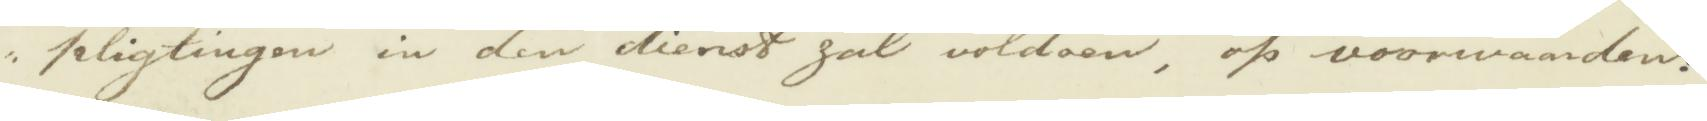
„pligtingen in den dienst zal voldoen, op voorwaarden:
